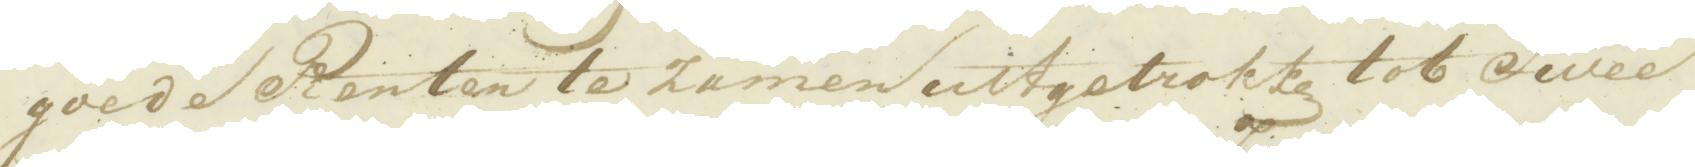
goede Renten te zamen uitgetrokken tot Twee
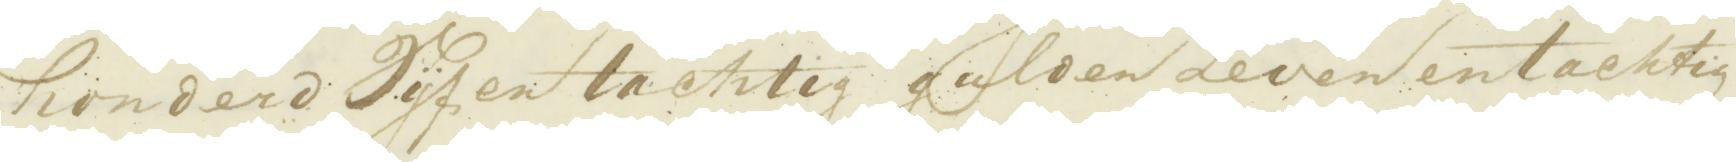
honderd Vijf en tachtig gulden Zeven en tachtig
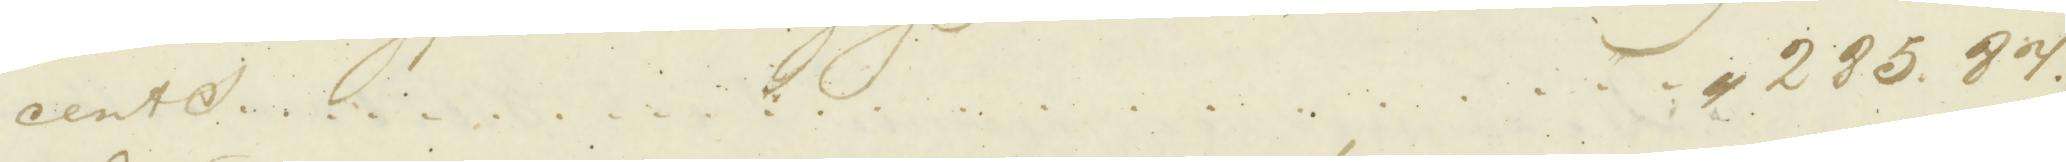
cents. . . . . . . . . . . . . . . . . . . . . . . „ 285.87.
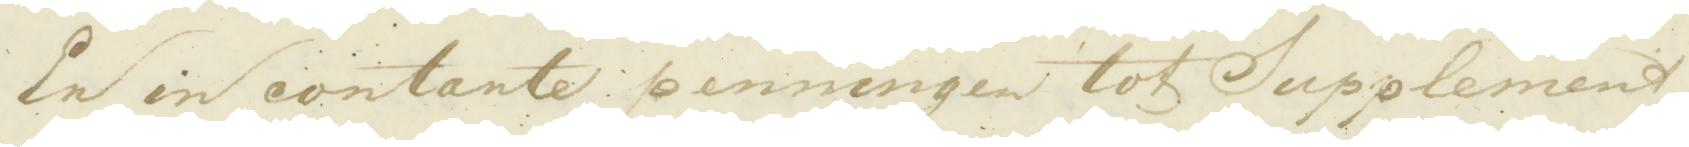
En in contante penningen tot supplement
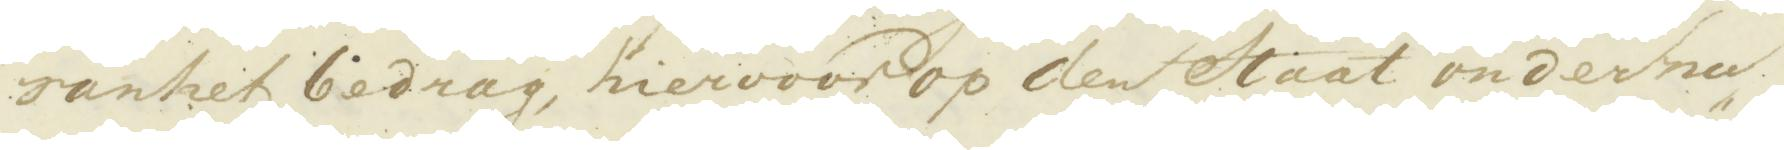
van het bedrag, hier voor op den staat onder nu„
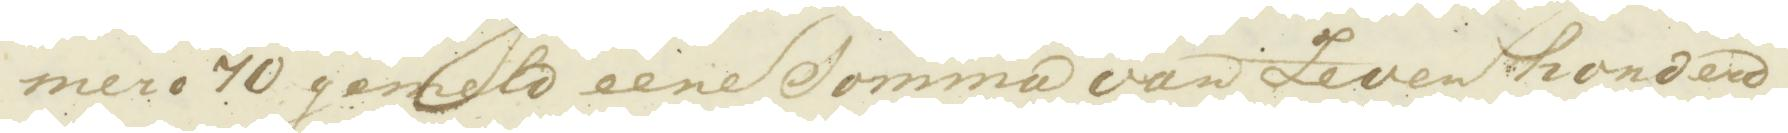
mero 70 gemeld eene somma van Zeven honderd
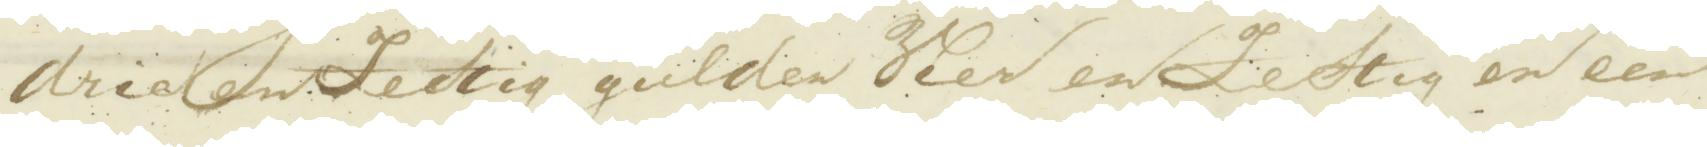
drie en Zestig gulden Vier en Zestig en een
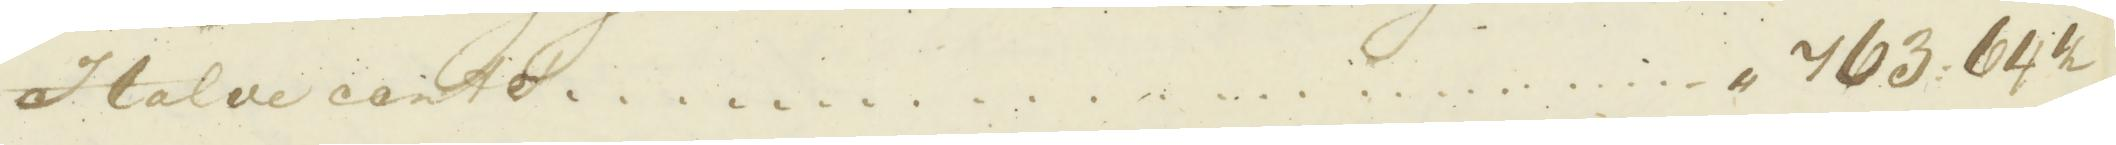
Halve cents. . . . . . . . . . . . . . . . . . . . . . . . . . . . . . . . „ 763.64½
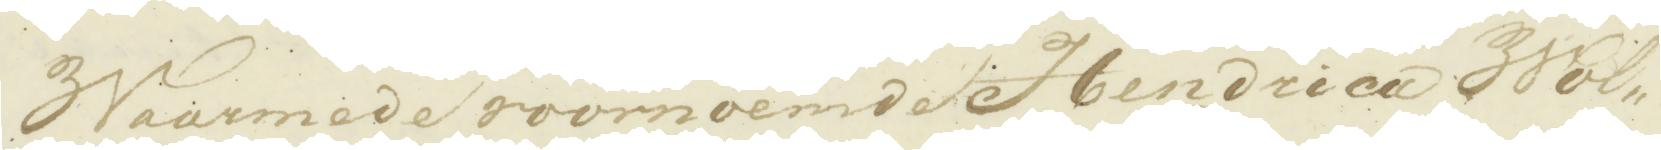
Waarmede voornoemde Hendrica Wol„
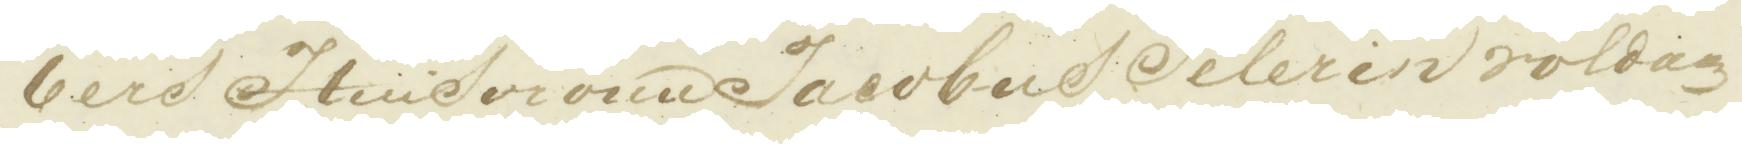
bers Huisvrouw Jacobus Pelerin voldaan
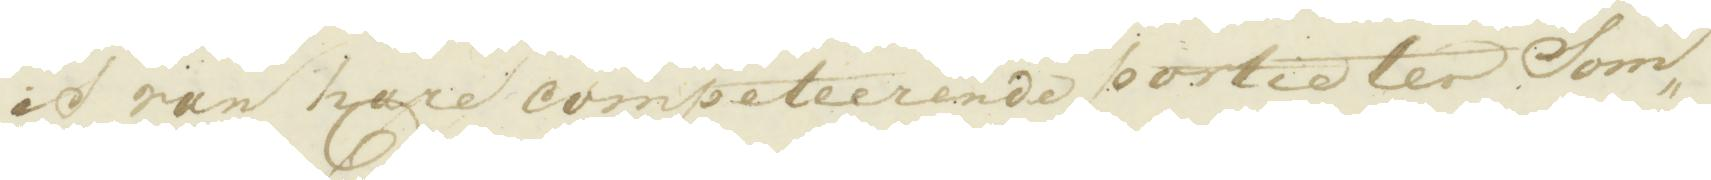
is van hare competeerende portie ter som„
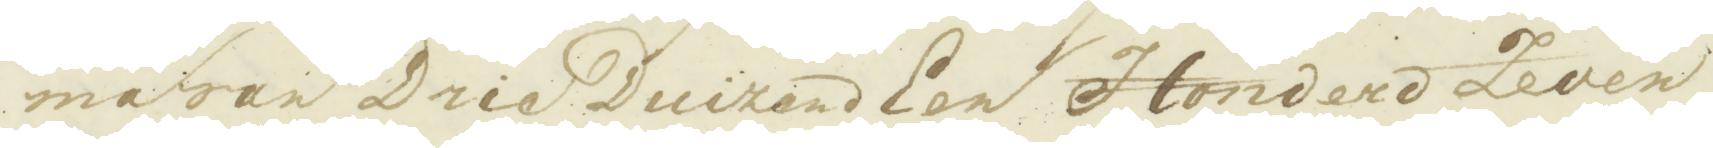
ma van Drie Duizend Een Honderd Zeven
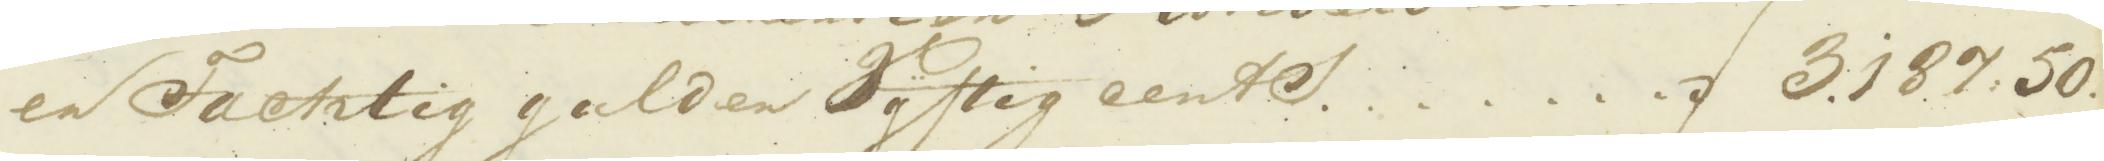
en Tachtig gulden Vijftig cents. . . . . . . ƒ 3.187.50.
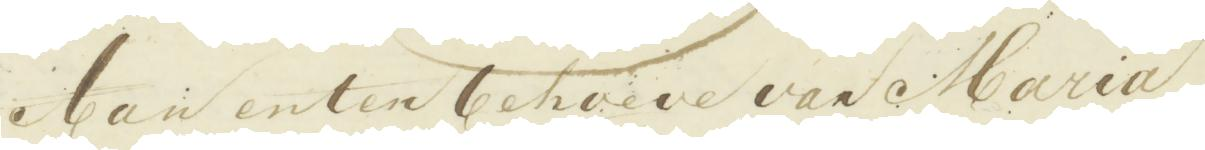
Aan en ten behoeve van Maria
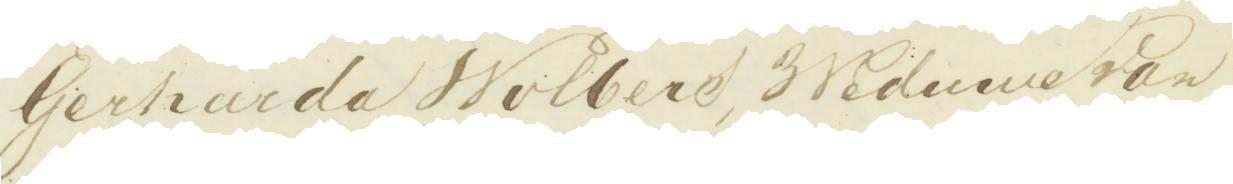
Gerharda Wolbers, Weduwe van
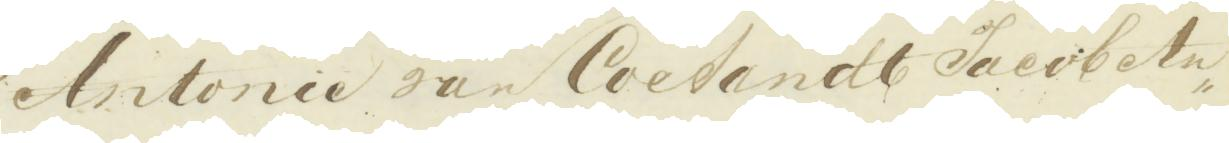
Antonie van Coesandt Jacob An„
